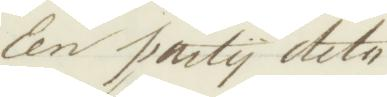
Een partij dito
